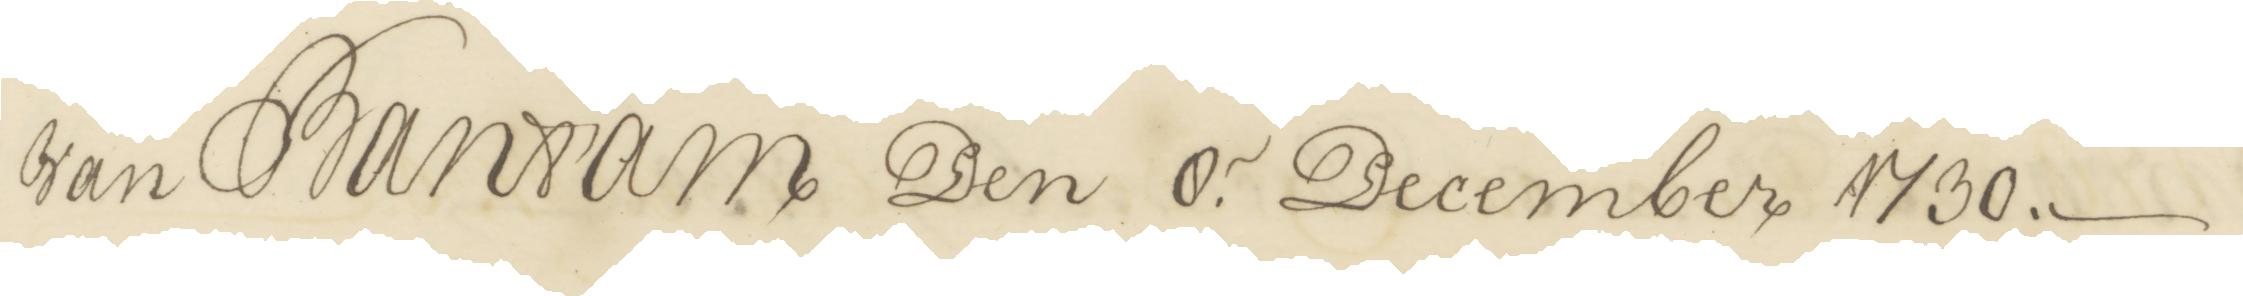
van Bantam Den 8:e December 1730. —
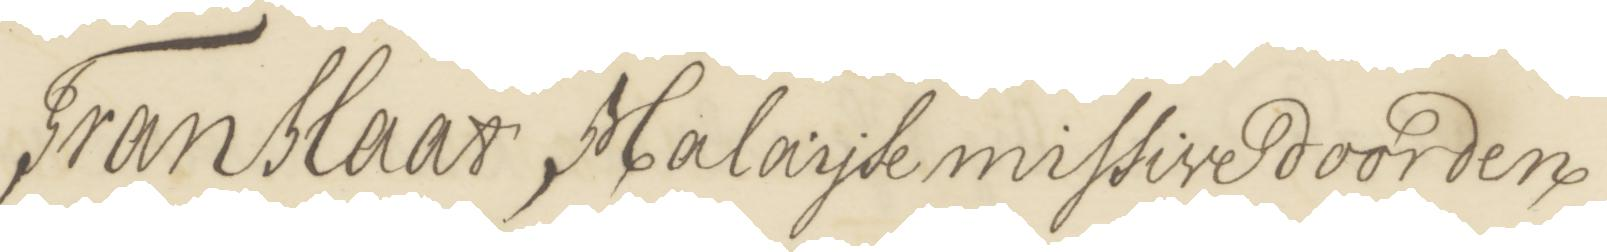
Translaat Malaijse missive door den
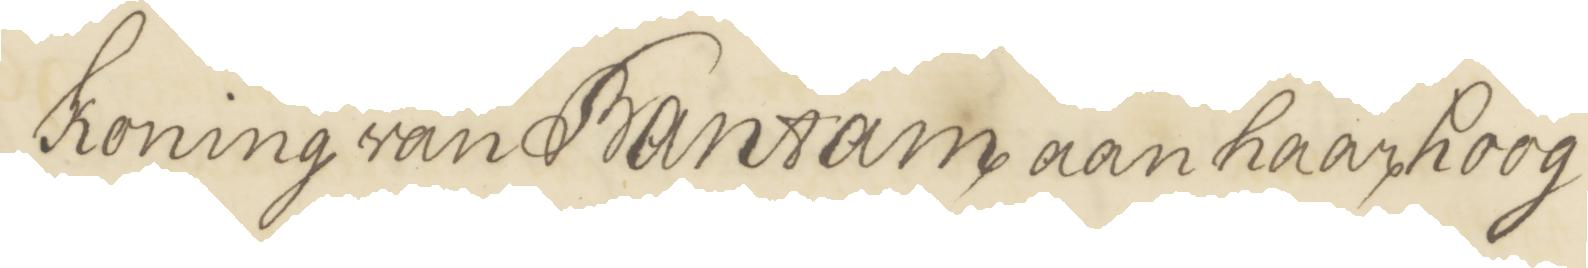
koning van Bantam aan haar hoog
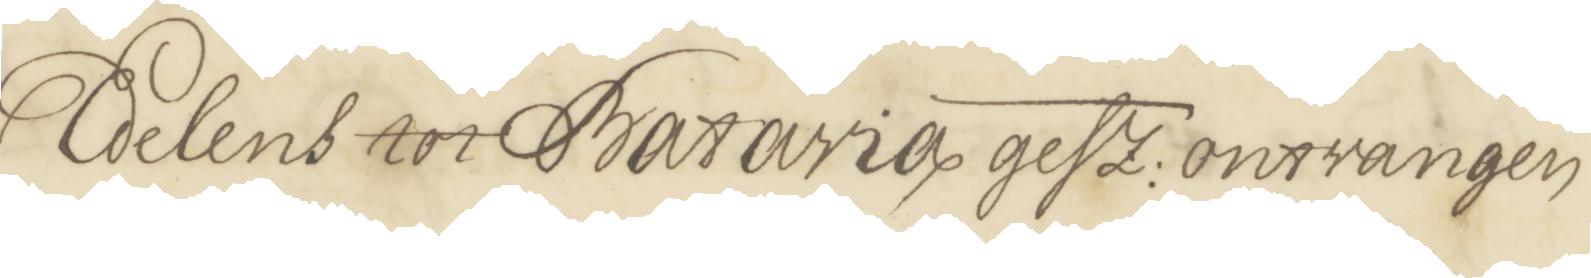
Edelens tot Batavia gesz: ontvangen
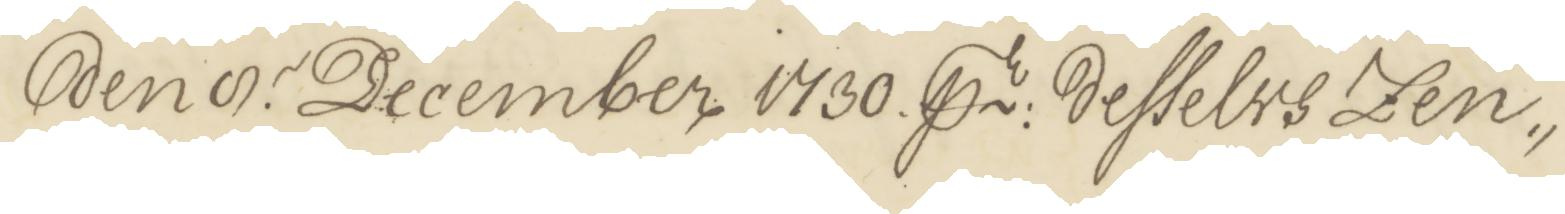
den 8:e December 1730. P:r desselvs zen„
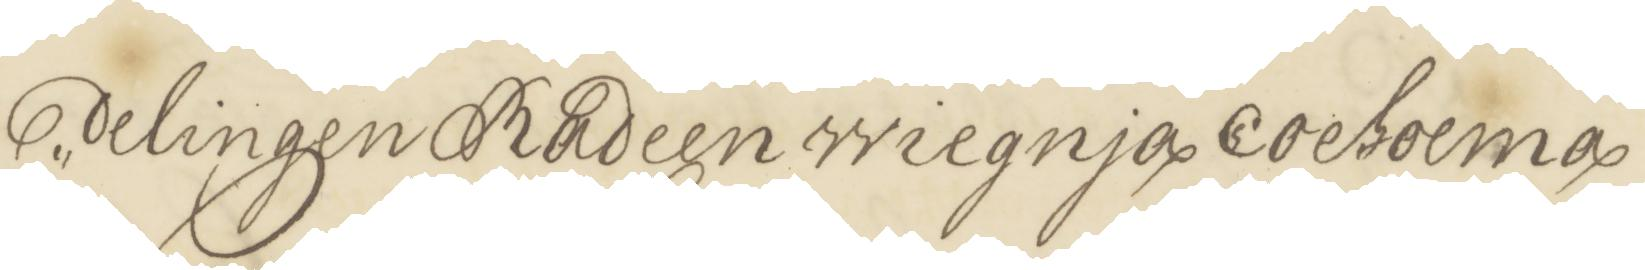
delingen Radeen wiegnja coesoema
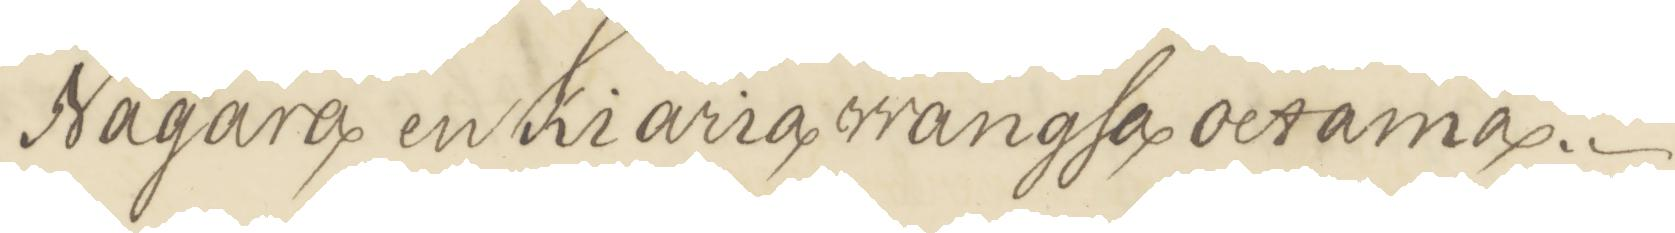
Nagara en kiaria wangsa oetama. —
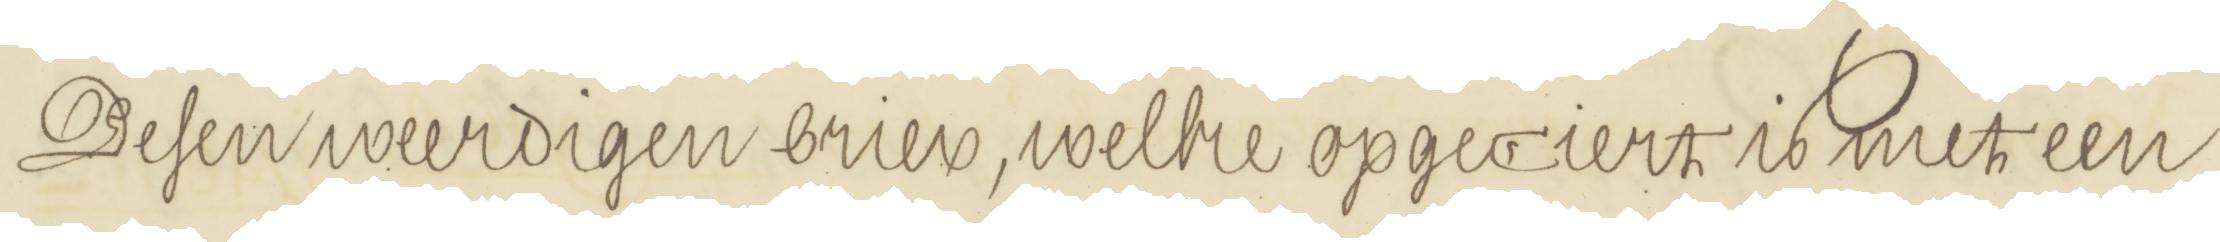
Desen weerdigen briev, welke opgeciert is met een
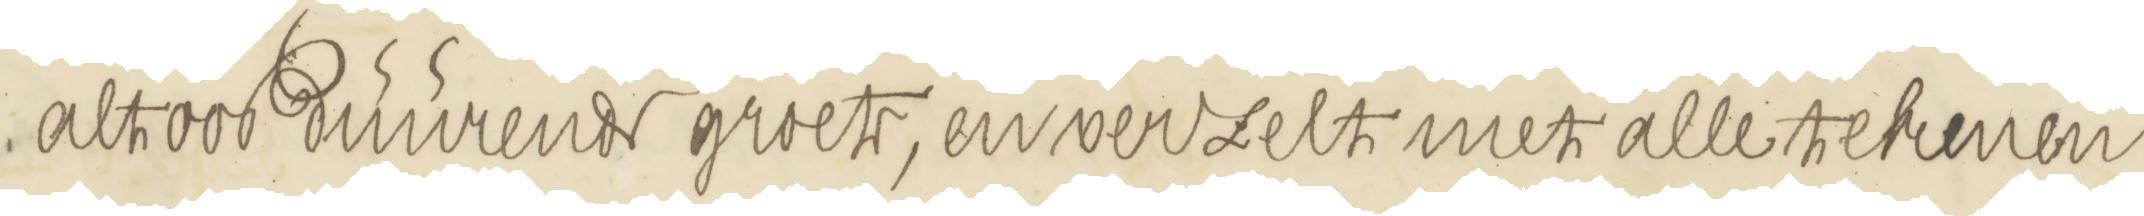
altoos duurende groete, en verzelt met alle tekenen
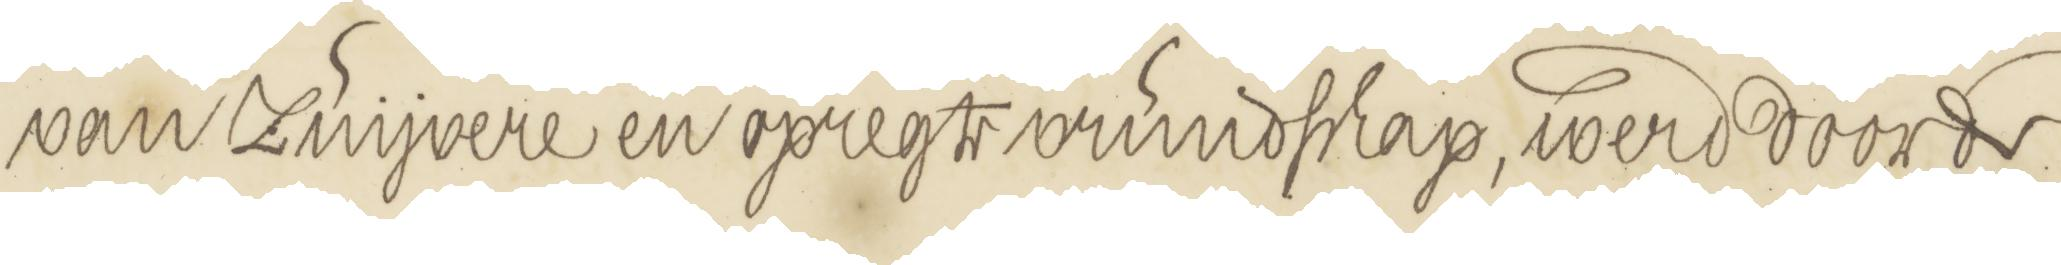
van zuijvere en opregte vrundschap, werd door de
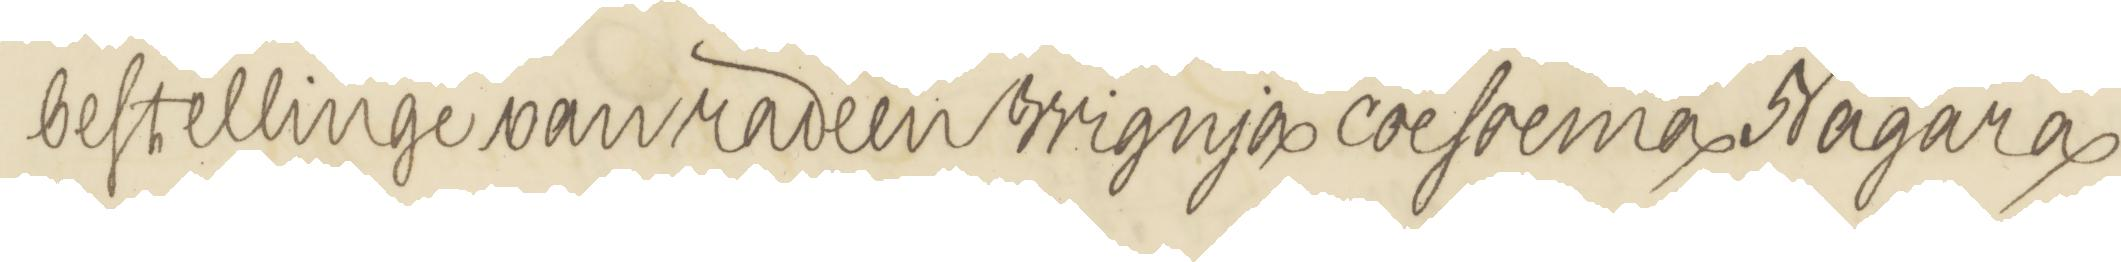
bestellinge van radeen wignja coesoema Nagara
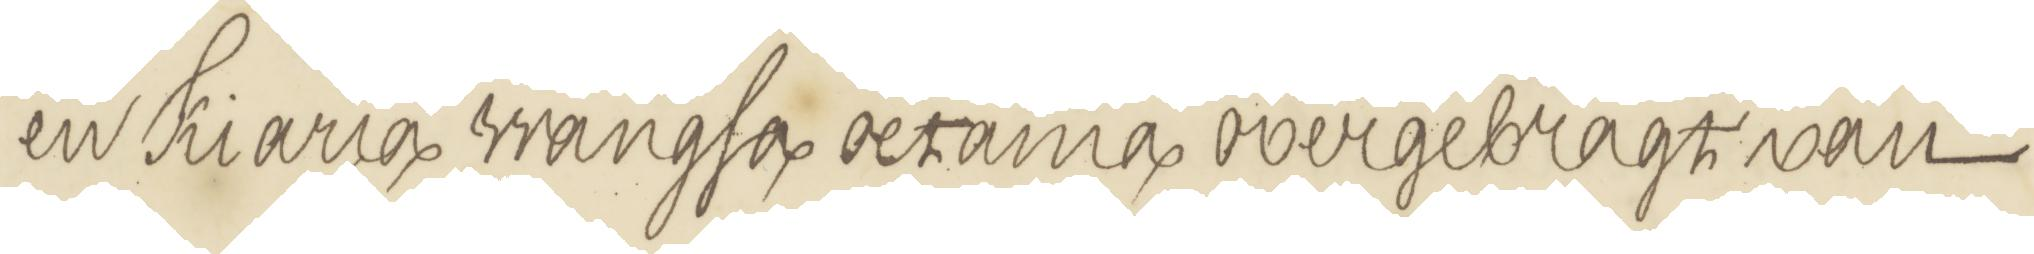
en kiaria wangsa oetama overgebragt van
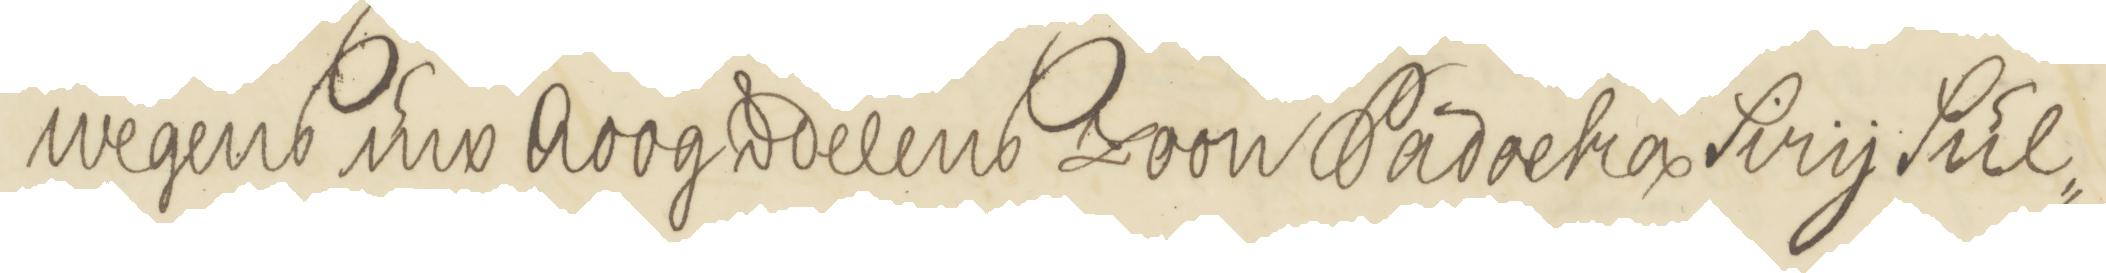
wegens uw hoog edelens zoon Padoeka Sirij Sul„
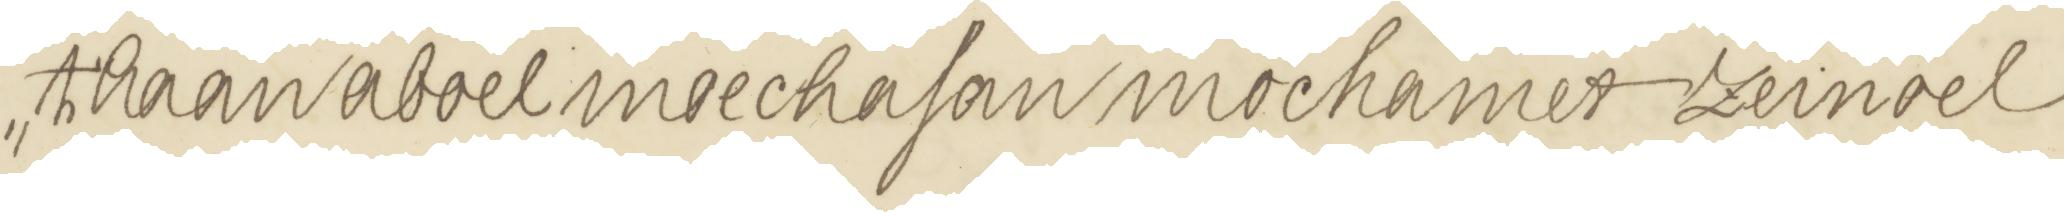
„thaan aboel moechasan mochamet zeinoel
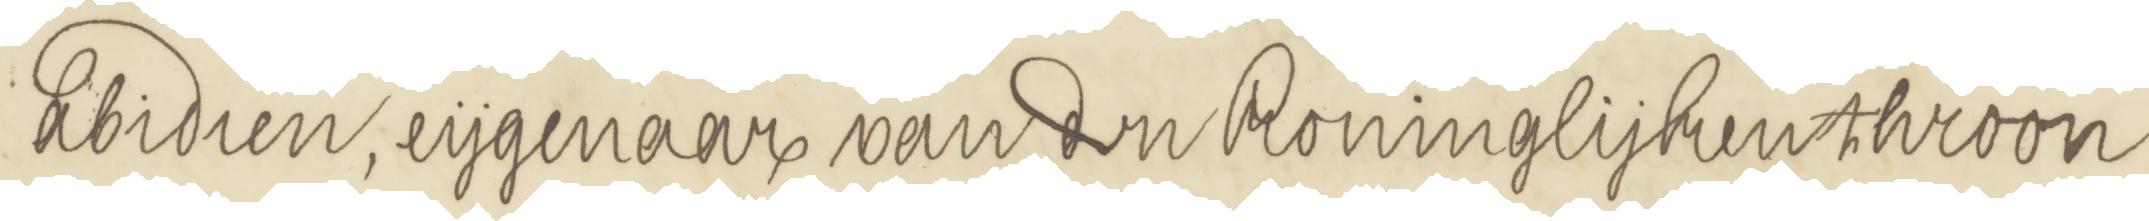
abidien, eijgenaar van den koninglijken throon
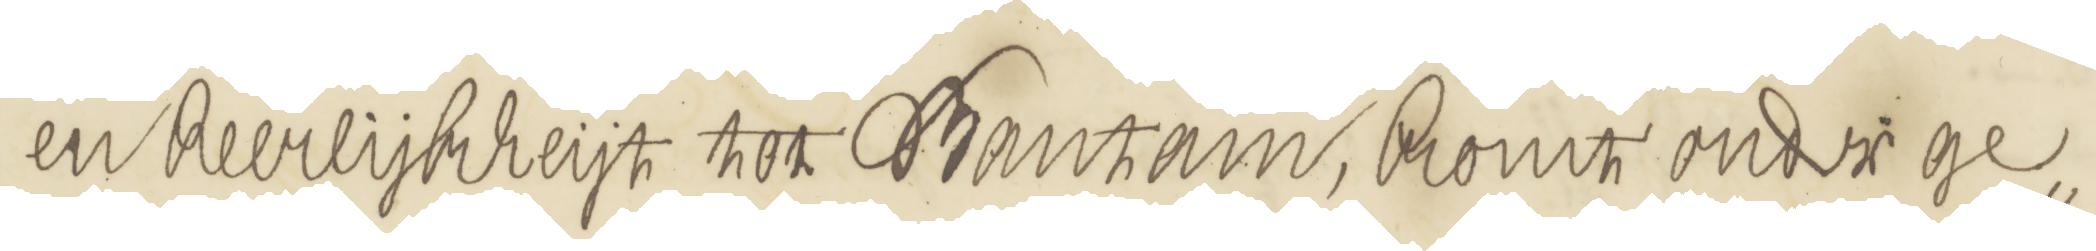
en heerlijkheijt tot Bantam, komt onder ge„
